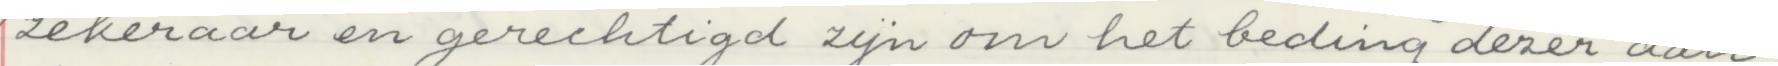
zekeraar en gerechtigd zijn om het beding dezer aan
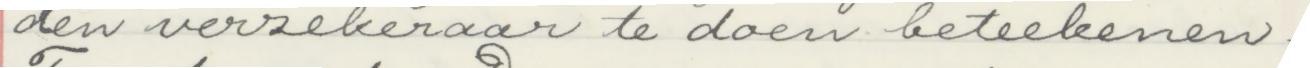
den verzekeraar te doen beteekenen.
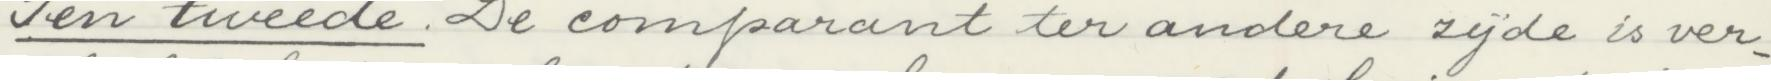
Ten tweede. De comparant ter andere zijde is ver
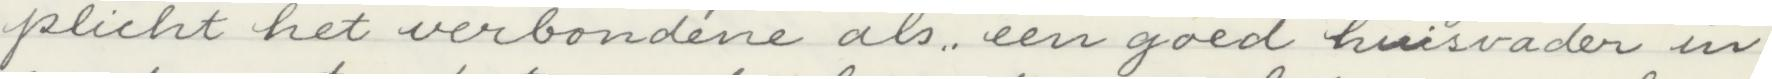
plicht het verbondene als, een goed huisvader in
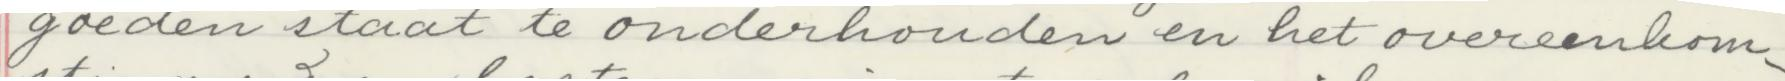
goeden staat te onderhouden en het overeenkom
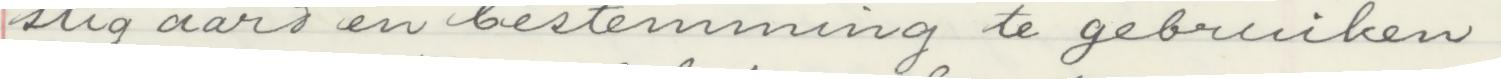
stig aard en bestemming te gebruiken
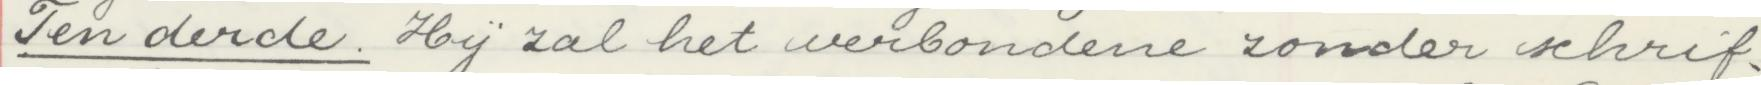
Ten derde. Hij zal het verbondene zonder schrif
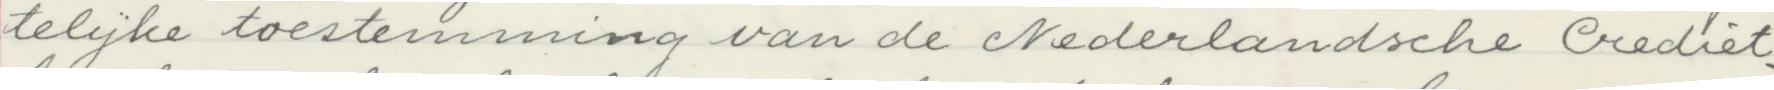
telijke toestemming van de Nederlandsche Crediet
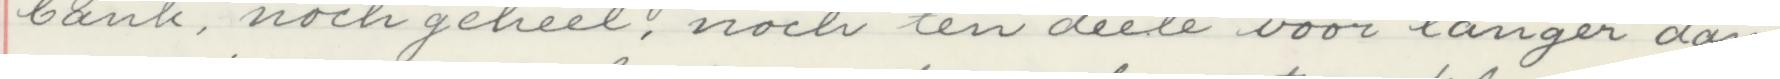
bank, noch geheel, noch ten deele voor langer dan
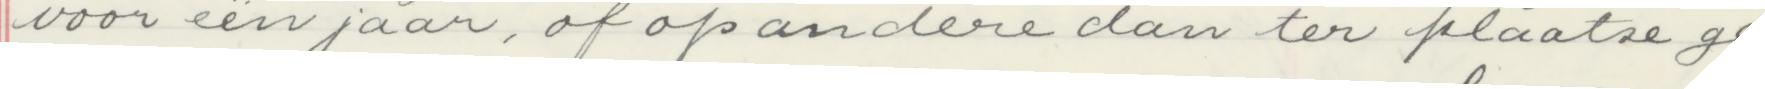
voor één jaar, of op andere dan ter plaatse ge
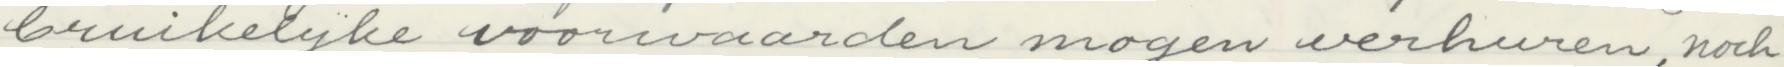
bruikelijke voorwaarden mogen verhuren, noch
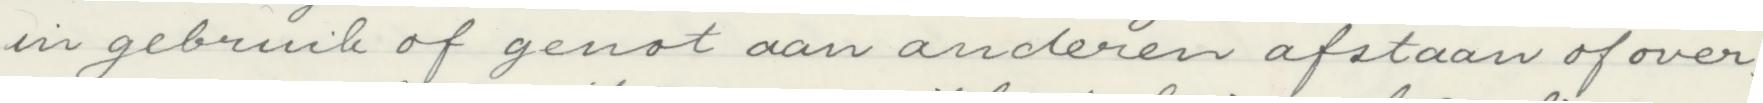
in gebruik of genot aan anderen afstaan of over
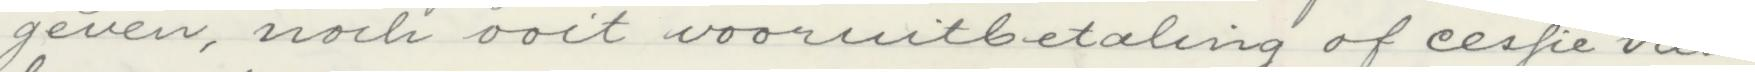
geven, noch ooit vooruitbetaling of cessie van
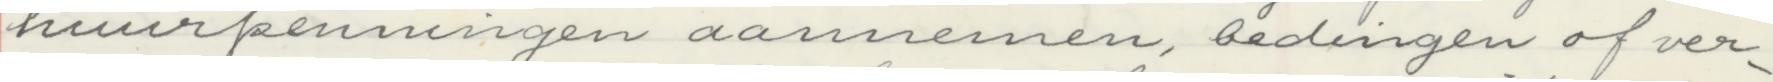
huurpenningen aannemen, bedingen of ver
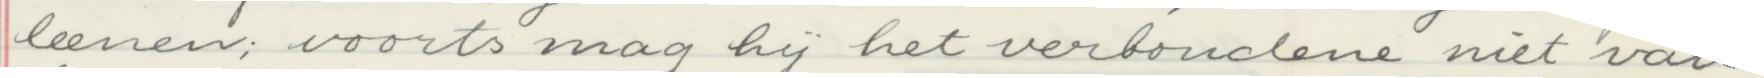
leenen; voorts mag hij het verbondene niet van
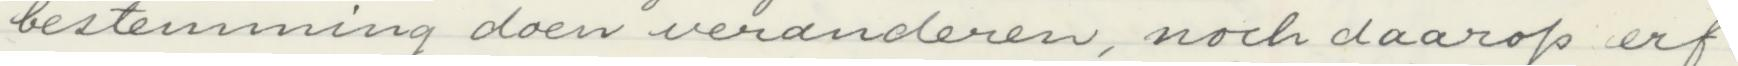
bestemming doen veranderen, noch daarop erf
